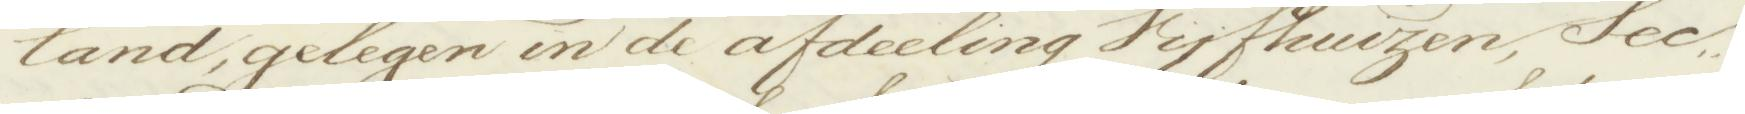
land, gelegen in de afdeeling Vijfhuizen, Sec„
